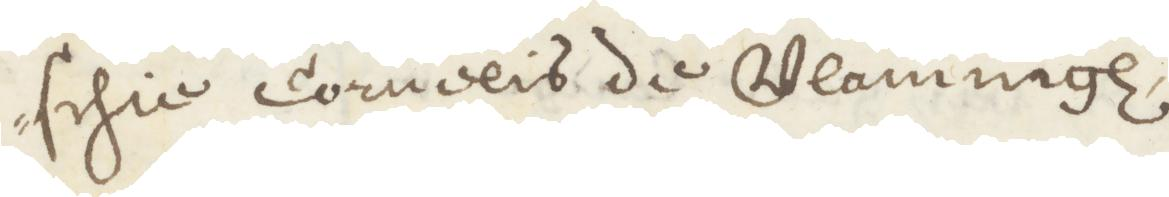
„schie cornelis de Vlamingh,
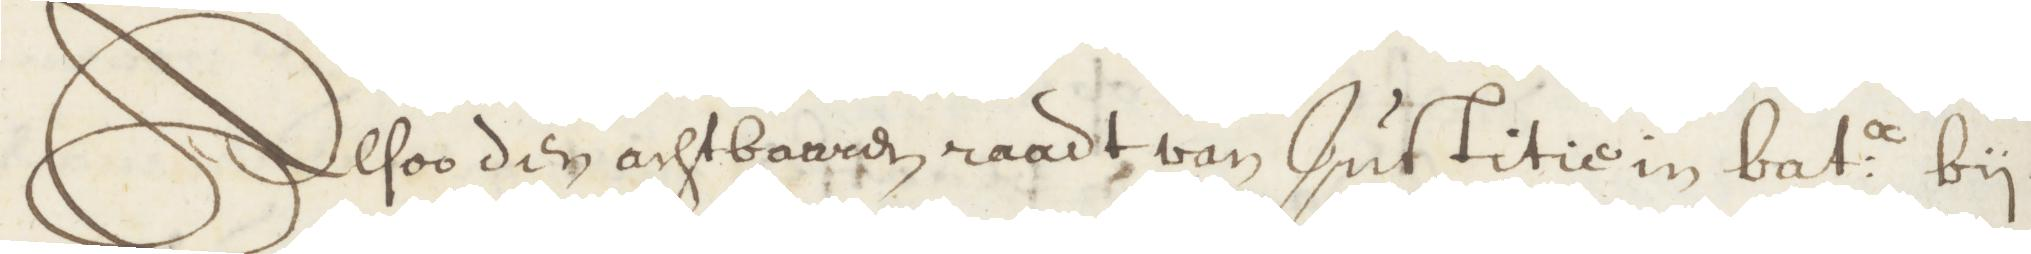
Alsoo den achtbaaren raadt van Justitie in bat:a bij
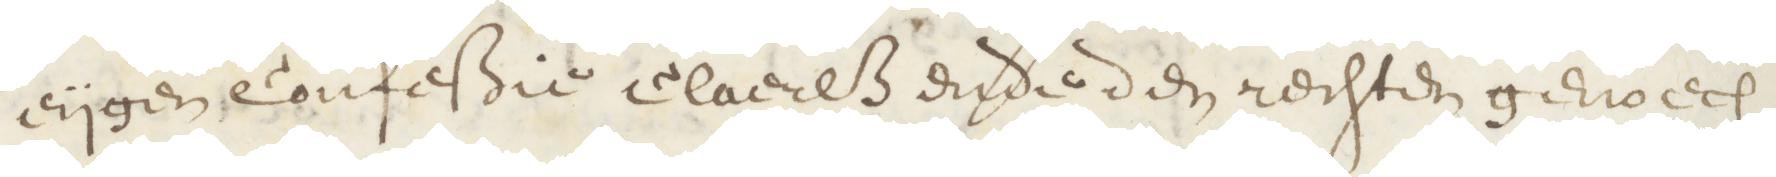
eijgen confessie claerlijk ende den rechten genoech
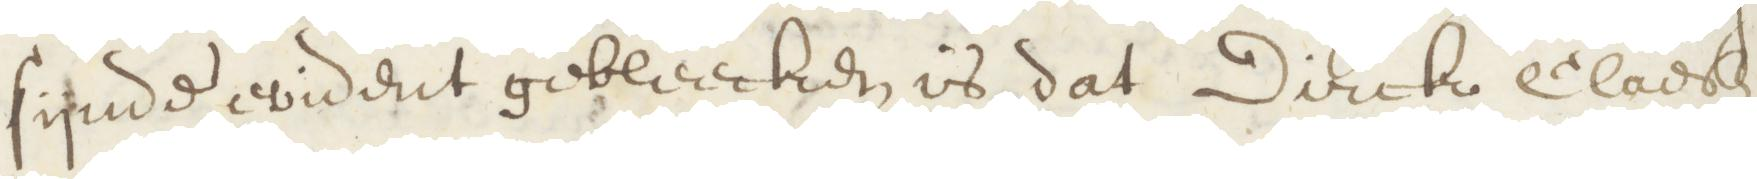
sijnde evident gebleecken is dat Dirck Claesen
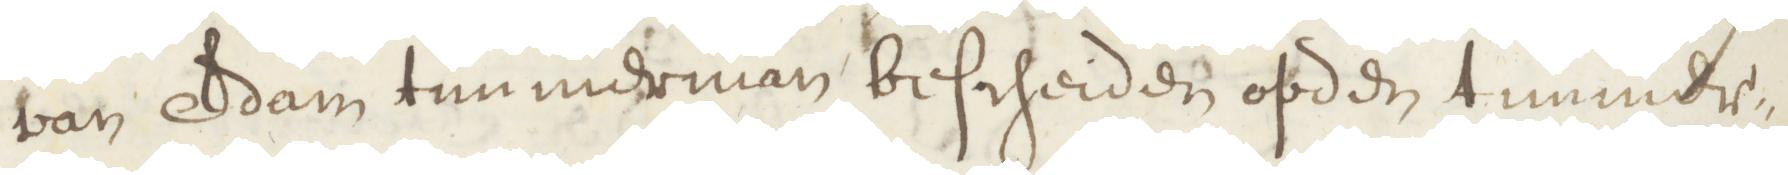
van Edam timmerman bescheiden op den timmer„
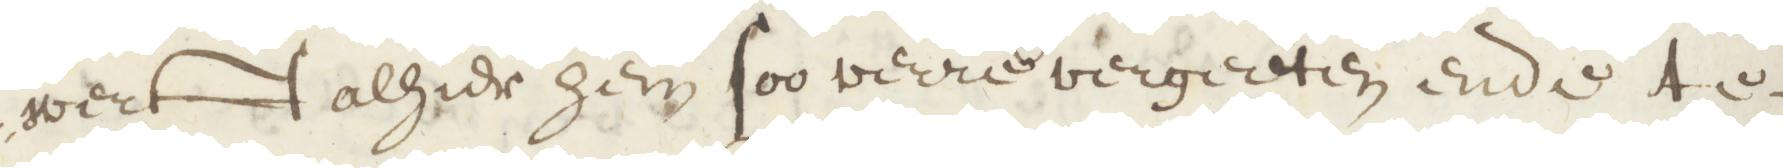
werff alhier hem soo verre vergeeten ende te-
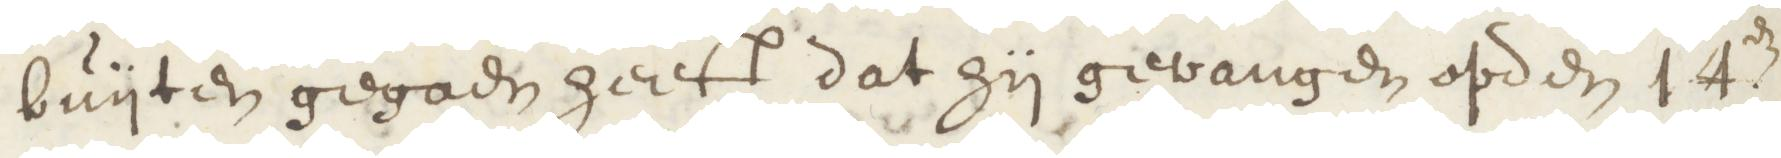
buijten gegaen heeft dat hij gevangen op den 14.en
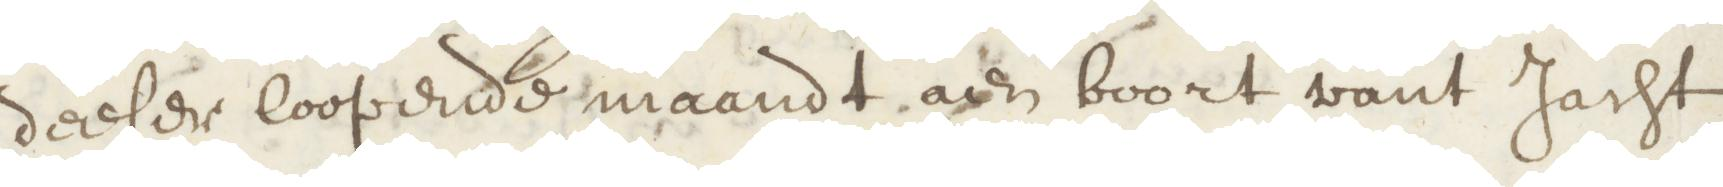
deeser loopende maandt aen boort vant Jacht
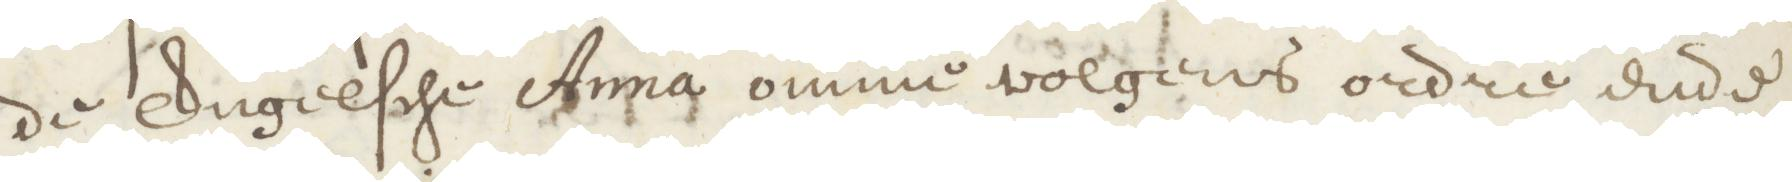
de Engelsche Anna omme volgens ordre ende
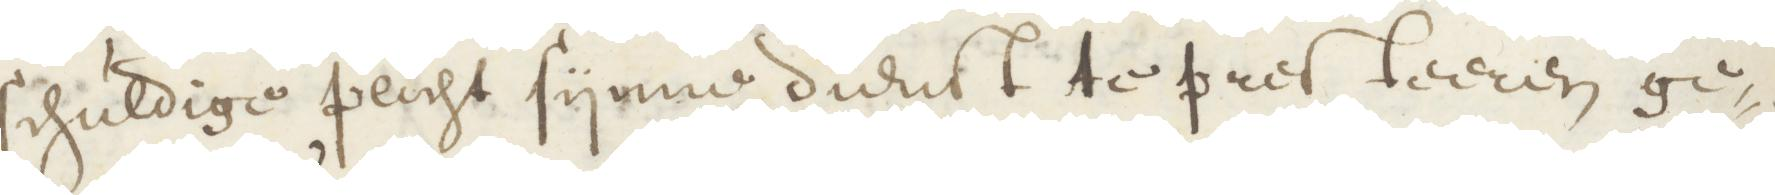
schuldige plicht sijnne dienst te presteeren ge„
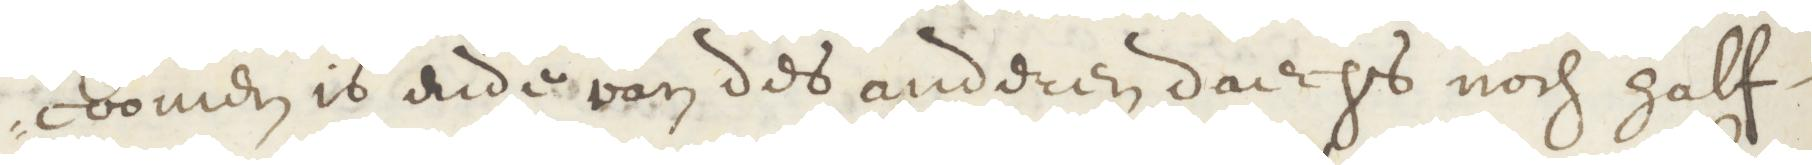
„coomen is ende van des anderen daechs noch half
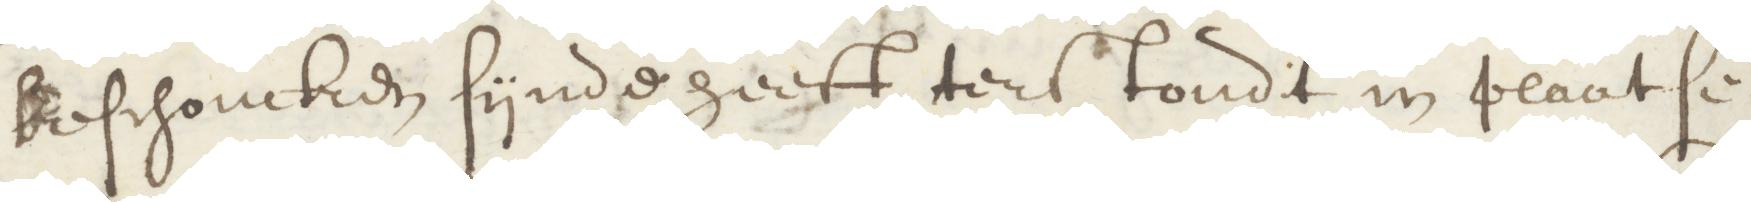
beschoncken sijnde heeft terstondt in plaatse
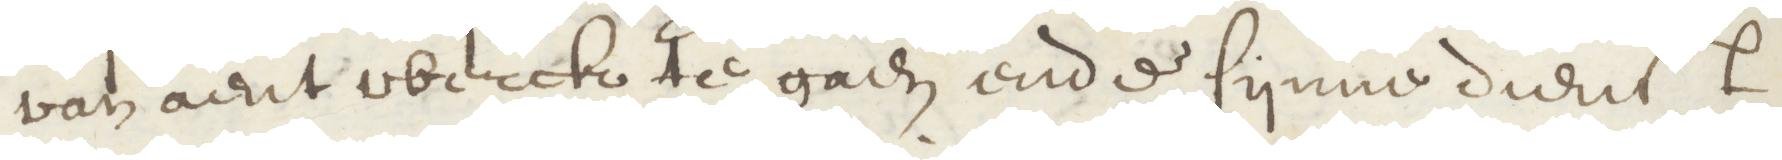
van aent werck te gaen ende sijnne dienst
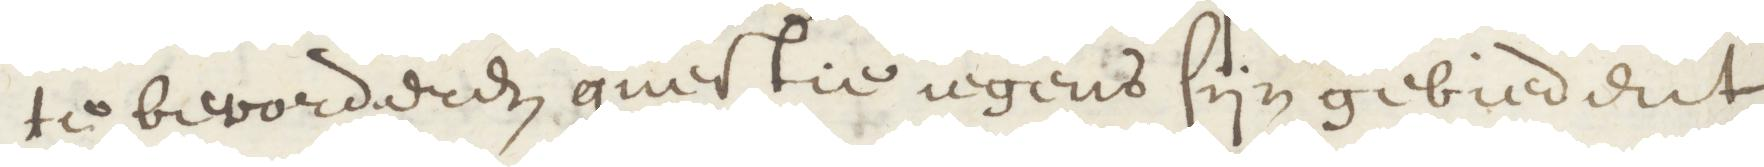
te bevorderen questie iegens sijn gebiedent
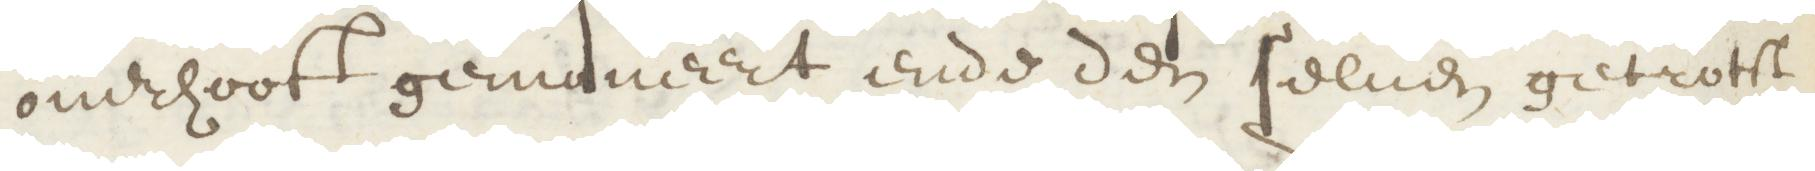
ouerhooft gemoueert ende den selven getrotst
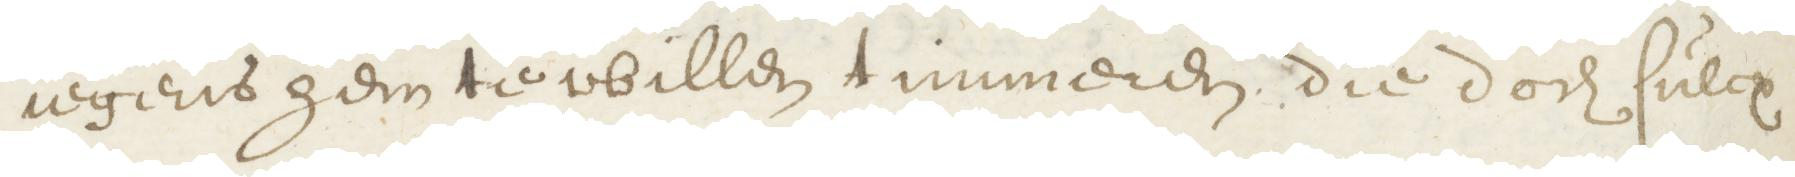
iegens hem te willen timmeren die doch sulcx
